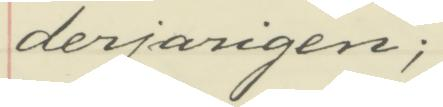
derjarigen;
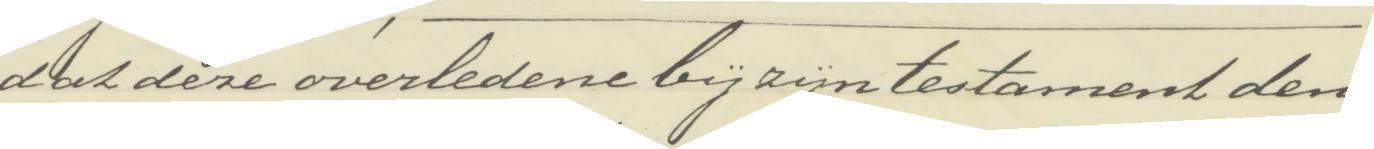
dat deze overledene bij zijn testament den
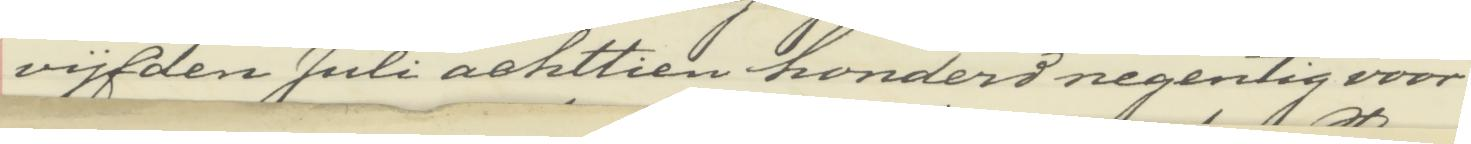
vijfden Juli achttien honderd negentig voor
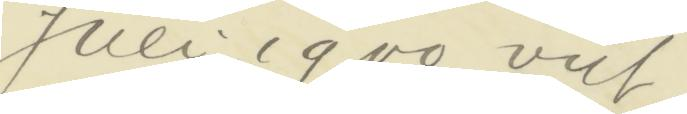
Juli 1900 vijf
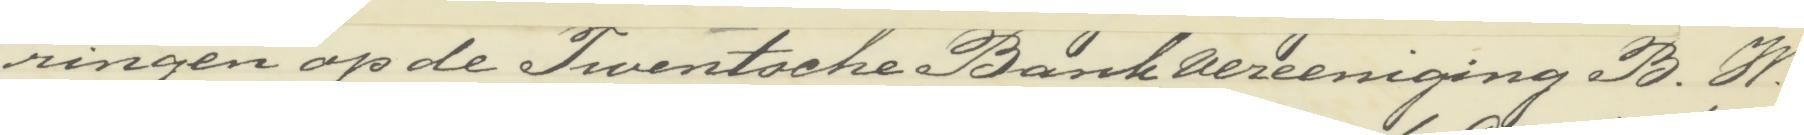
ringen op de Twentsche Bankvereeniging B. W.
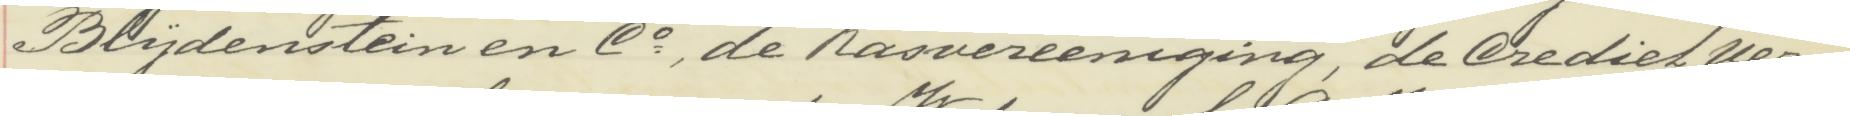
Blijdenstein en C=o, de Kasvereeniging de Crediet ver=
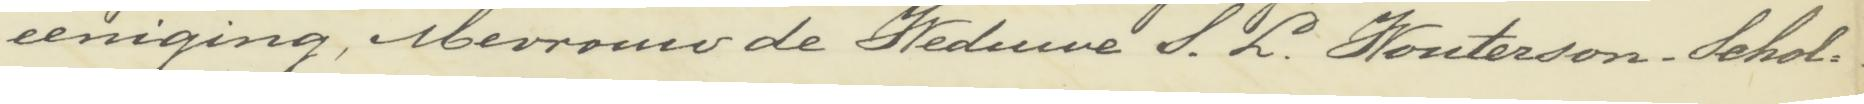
eeniging, Mevrouw de Weduwe S. P. Wouterson - Schol=
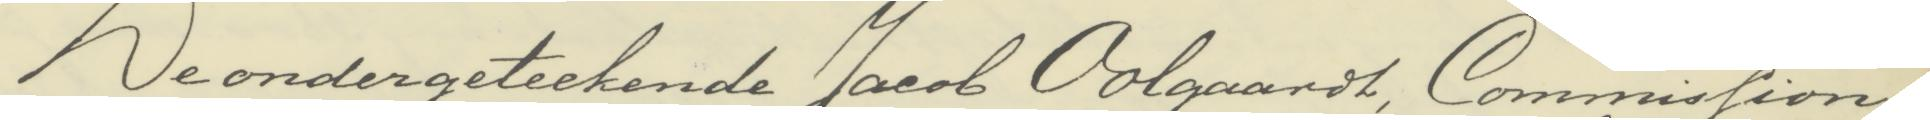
De ondergeteekende Jacob Oolgaardt, Commission=
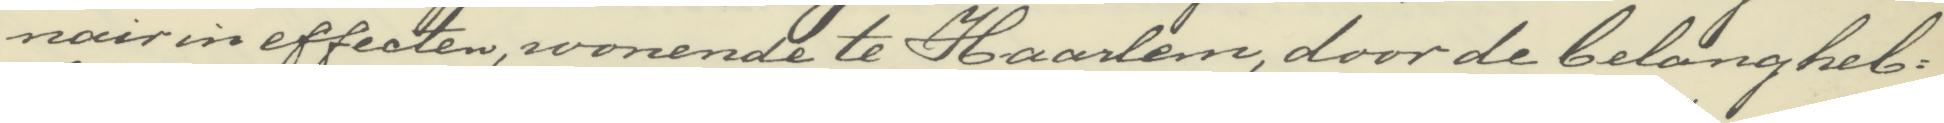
nair in effecten, wonende te Haarlem, door de belangheb=
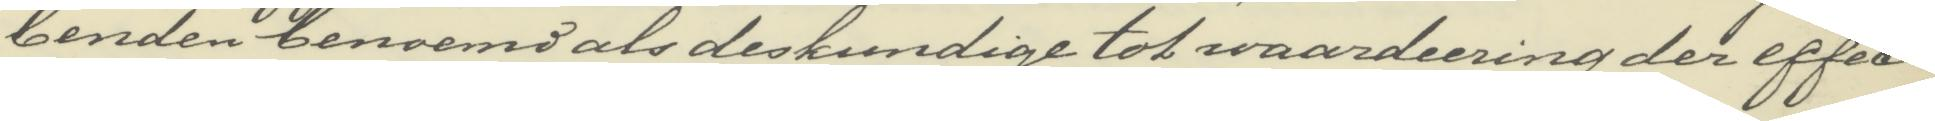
benden benoemd als deskundige tot waardeering der effec=
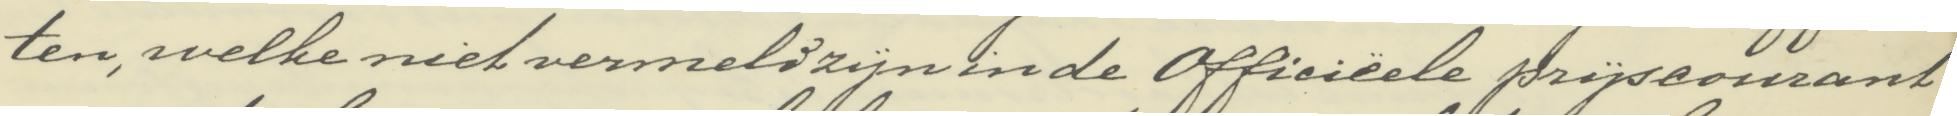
ten, welke niet vermeld zijn in de Officiëele prijscourant
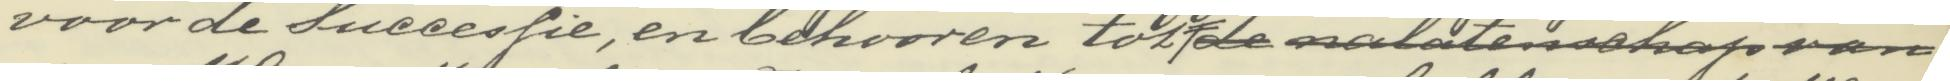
voor de successie, en behooren tot ¶ de nalatenschap van
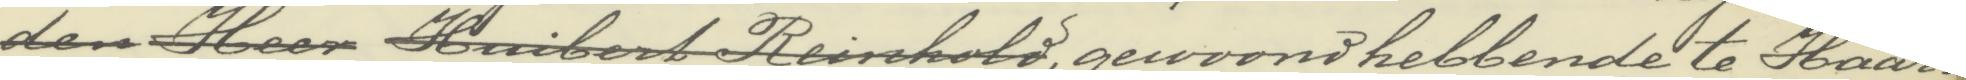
den Heer Huibert Reinhold, gewoond hebbende te Haar=
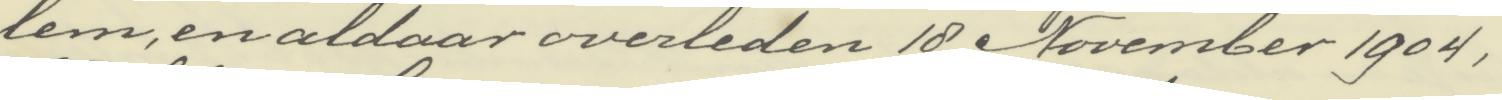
lem, en aldaar overleden 18 November 1904,
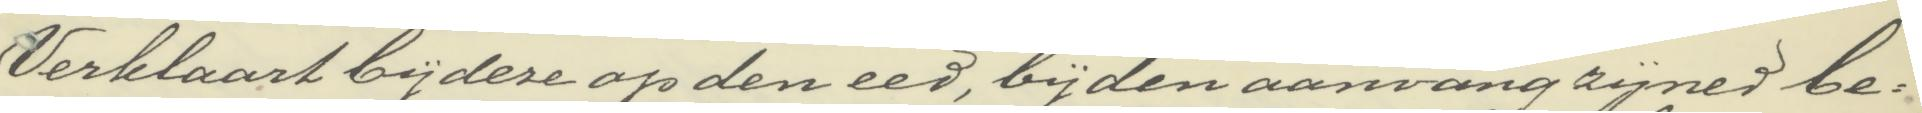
Verklaart bij deze op den eed, bij den aanvang zijner be„
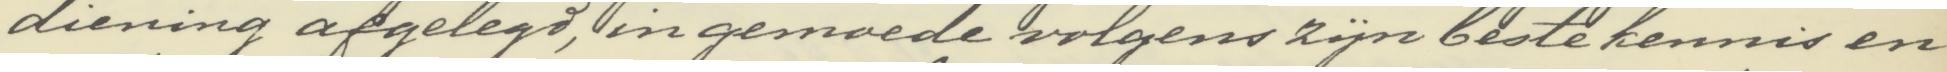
diening afgelegd, in gemoede volgens zijn beste kennis en
